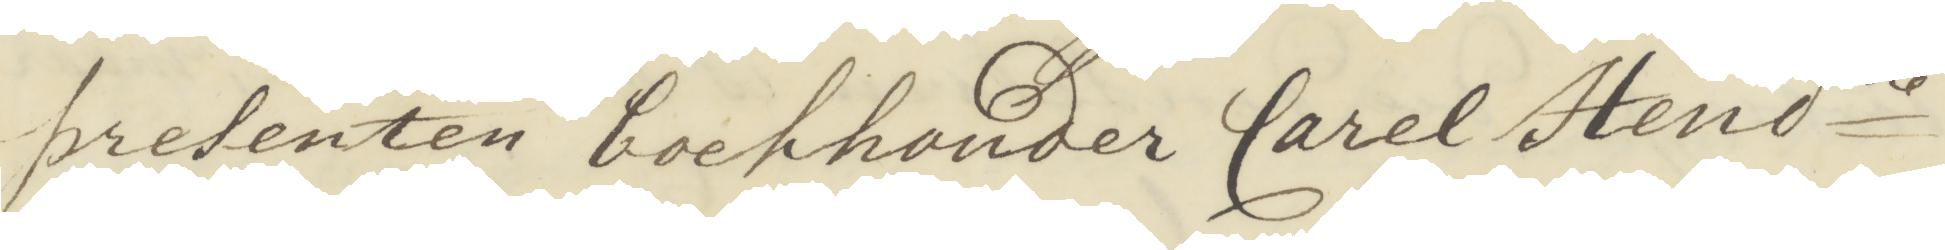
presenten boekhouder Carel Hend=k
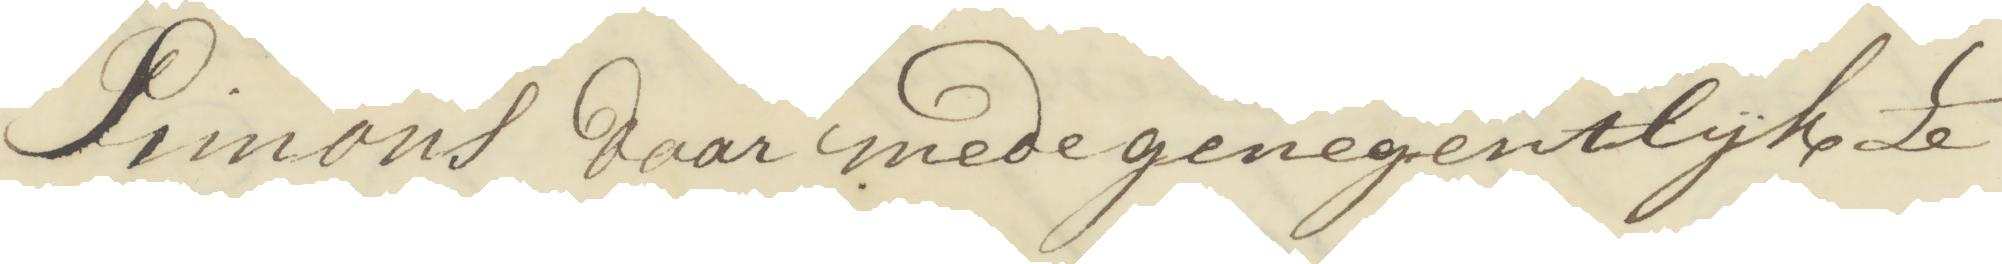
Simons daar mede genegentlijk te
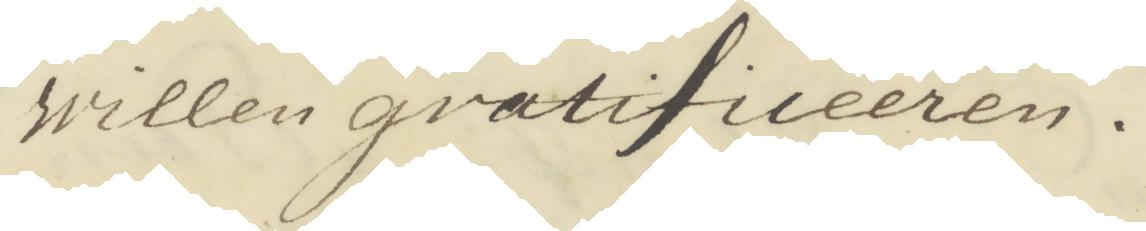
willen gratificeeren.
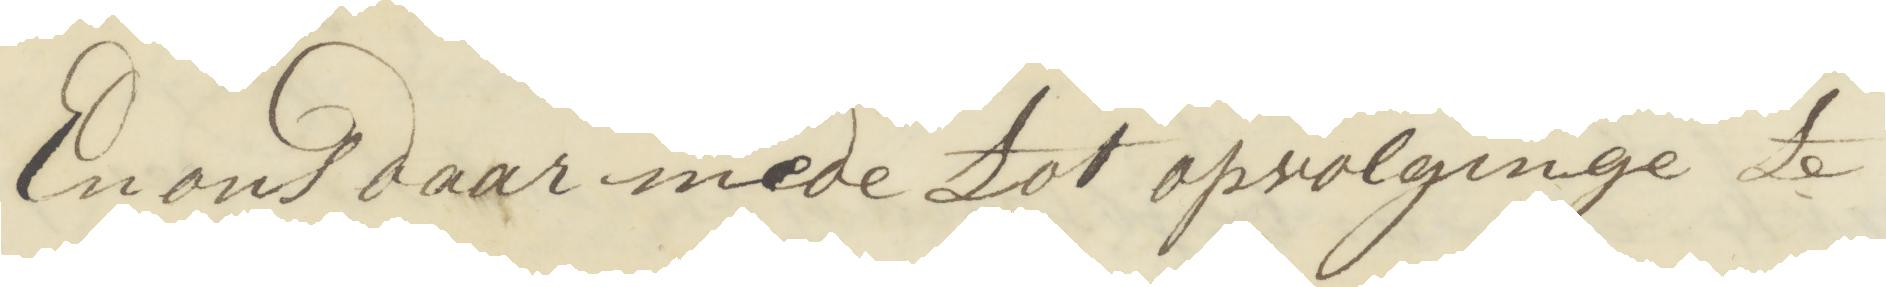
En ons daar mede tot opvolginge te
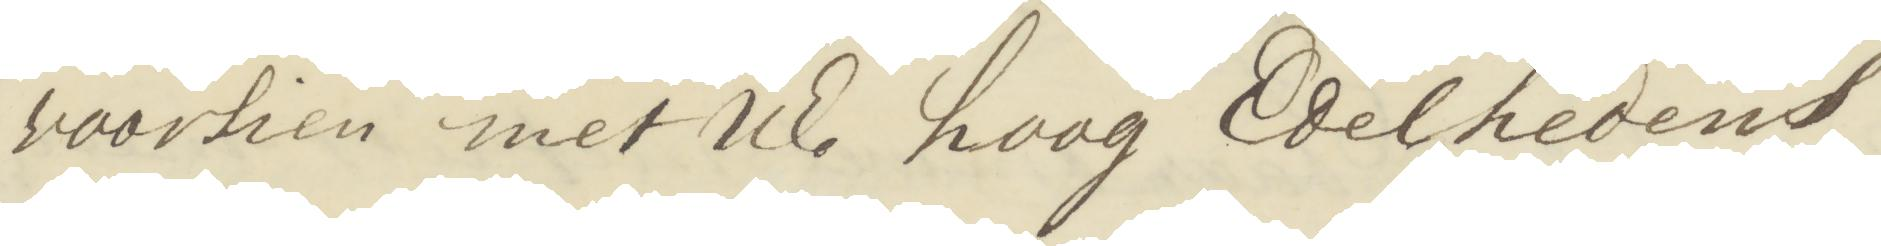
voorsien met uE hoog Edelhedens
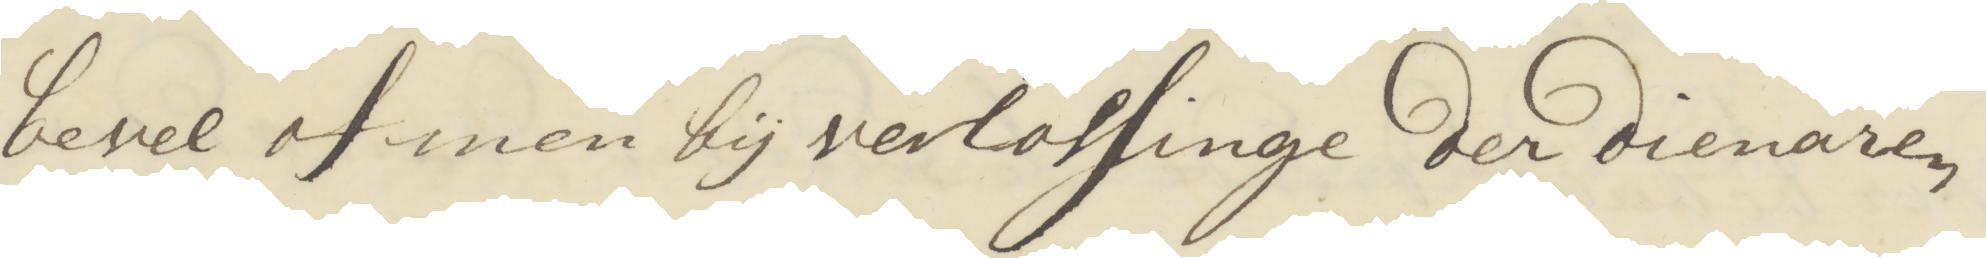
bevel of men bij verlossinge der dienaren
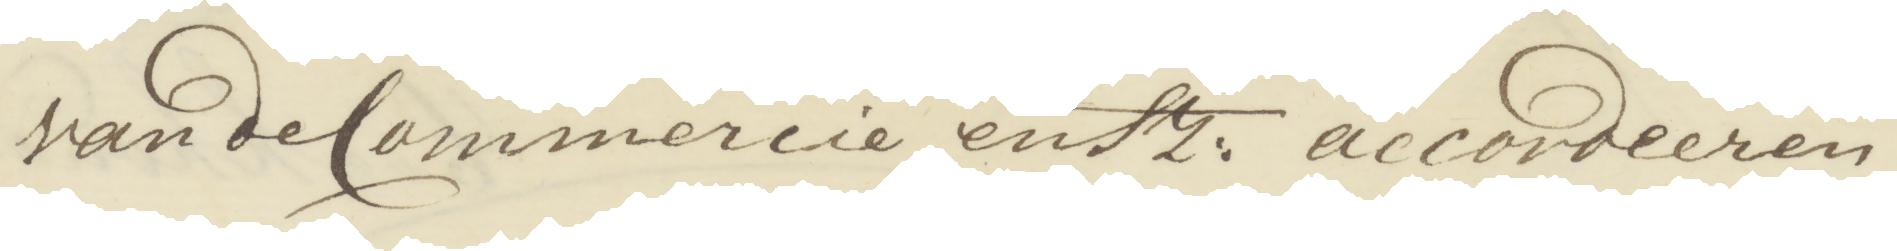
van de Commercie ensz: accordeeren
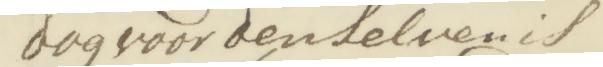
dog voor denselven is
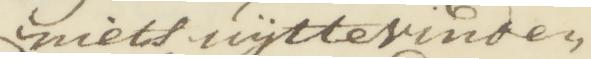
niets uijttevinden
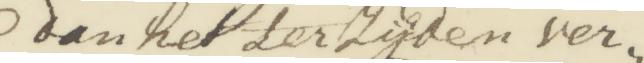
dan het ter zijden ver„
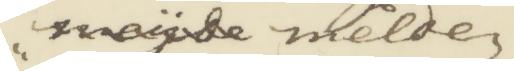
„meijde melden
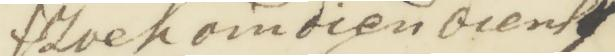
verzoek om dien dienst
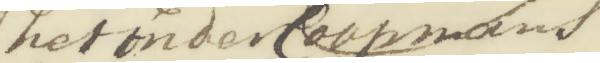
het ondercoopmans
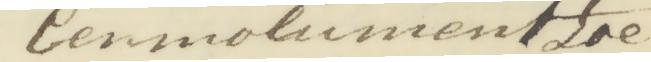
Eenmolument toe
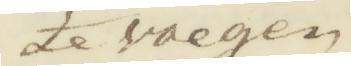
te voegen
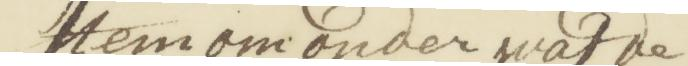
Item om onder wat de
